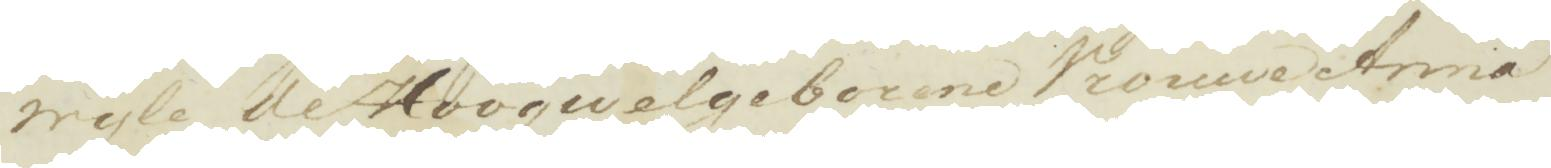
wijle de Hoogwelgeborene Vrouwe Anna
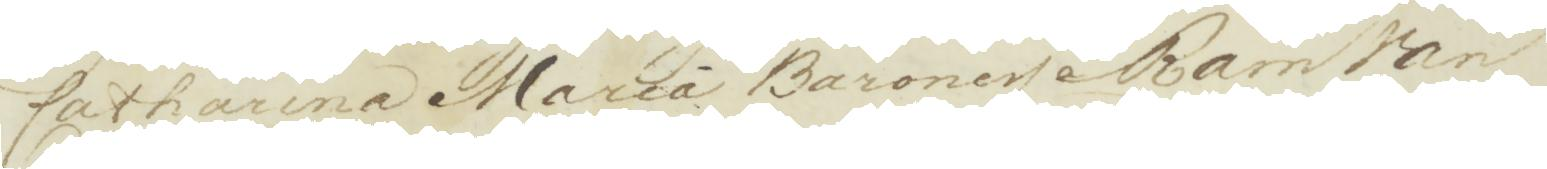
Catharina Maria Baronesse Ram van
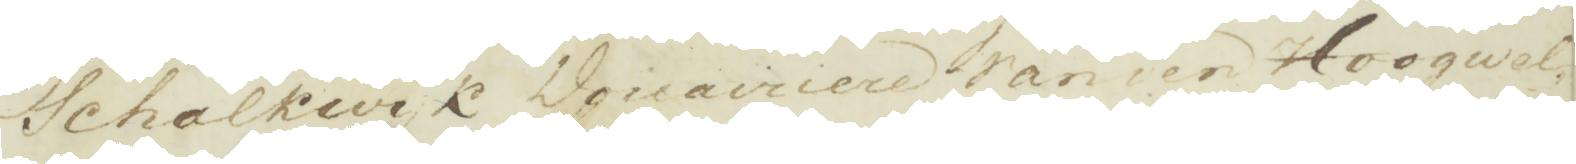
Schalkwijk Douairiere van den Hoogwel„
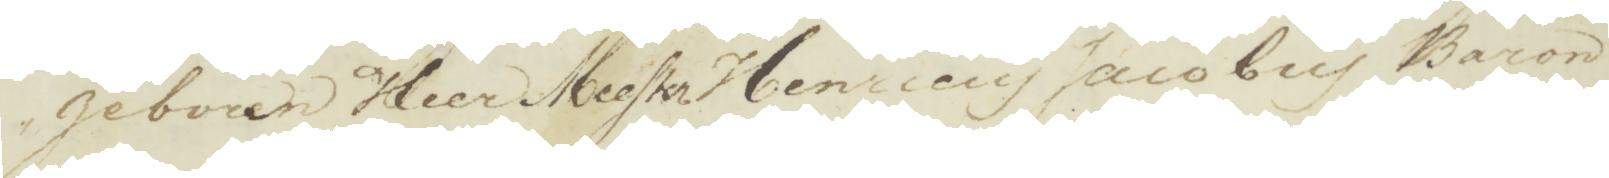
„geboren Heer Meester Henricus Jacobus Baron
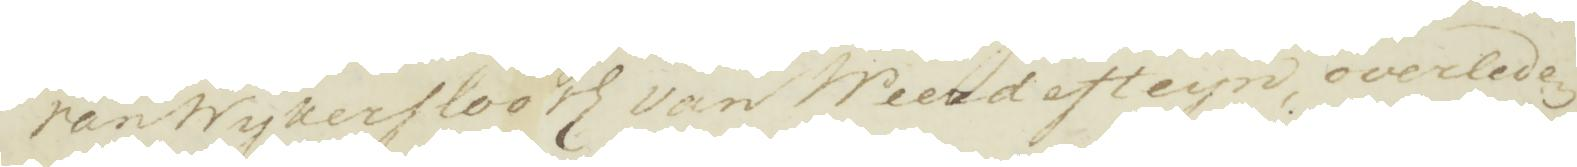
van Wijkerslooth van Weerdesteijn, overleden
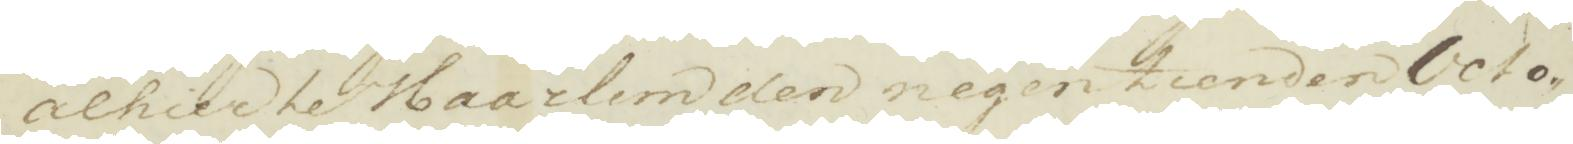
alhier te Haarlem den negentienden Octo„
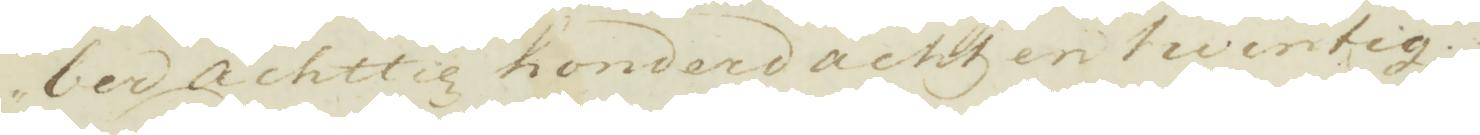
„ber achttien honderd acht en twintig.
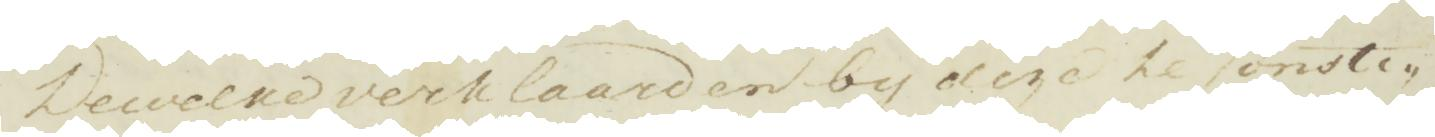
Dewelke verklaarden by deze te Consti„
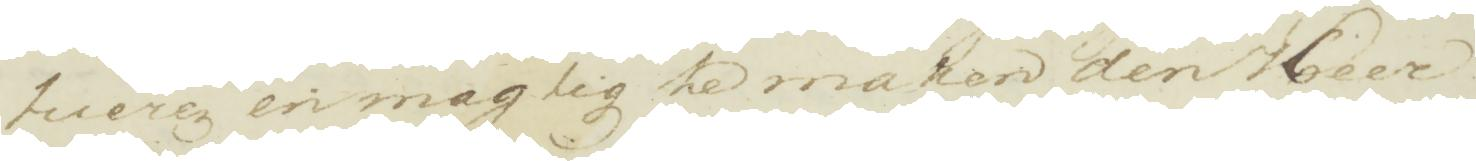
tueren en magtig te maken den Heer
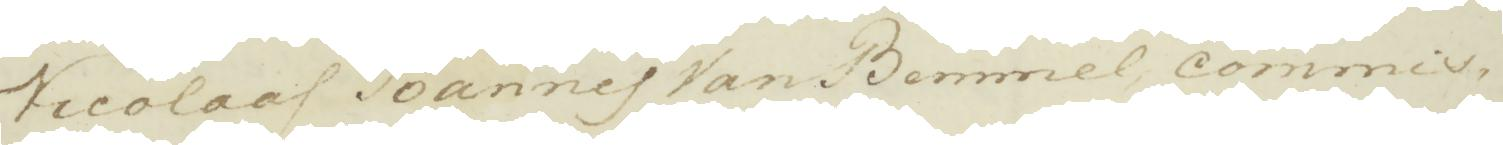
Nicolaas Ioannes Van Bemmel, Commis,
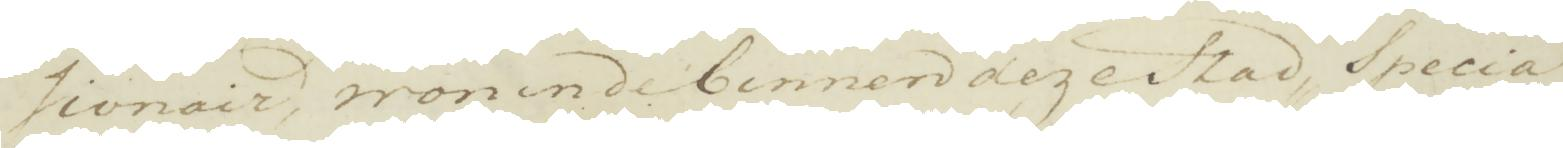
sionair, wonende binnen deze Stad, specia
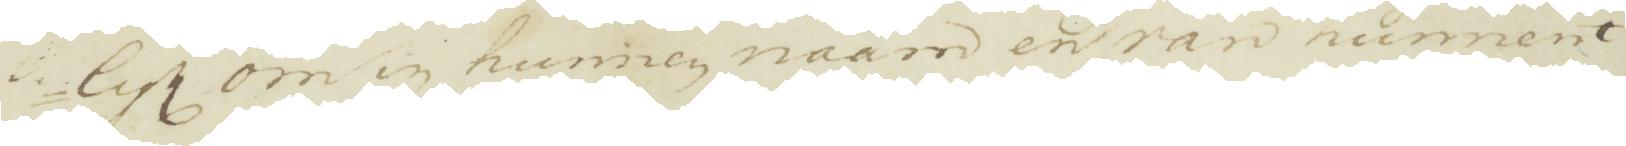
=lijk om in hunnen naam en van hunnent
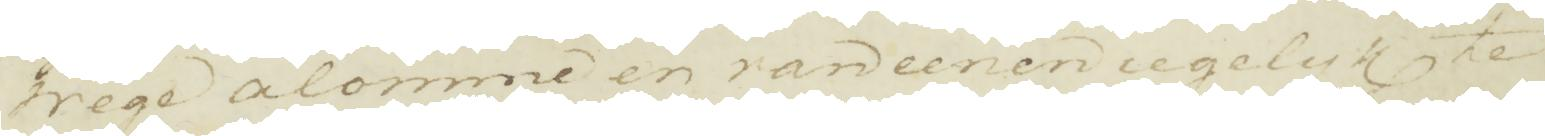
wege alomme en van eenen iegelyk te
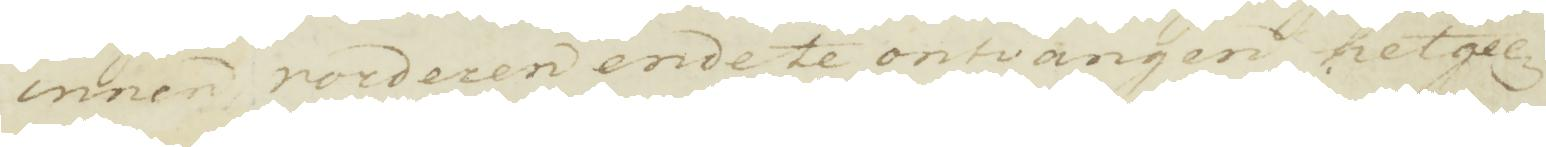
innen, vorderen ende te ontvangen hetgeen
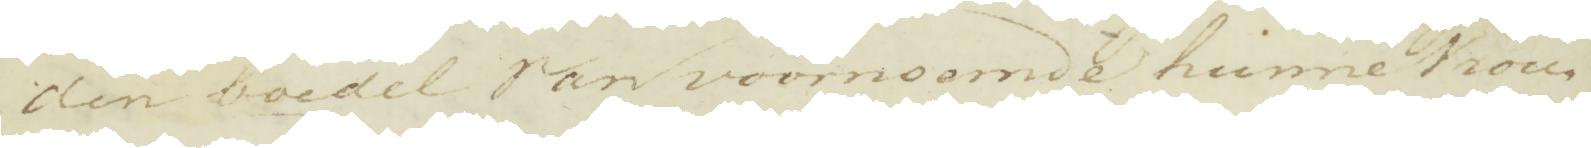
den Boedel van voornoemde hunne Vrou
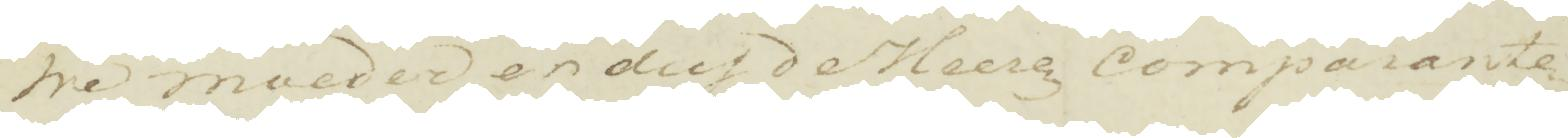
we moeder en dus de Heeren comparanten
